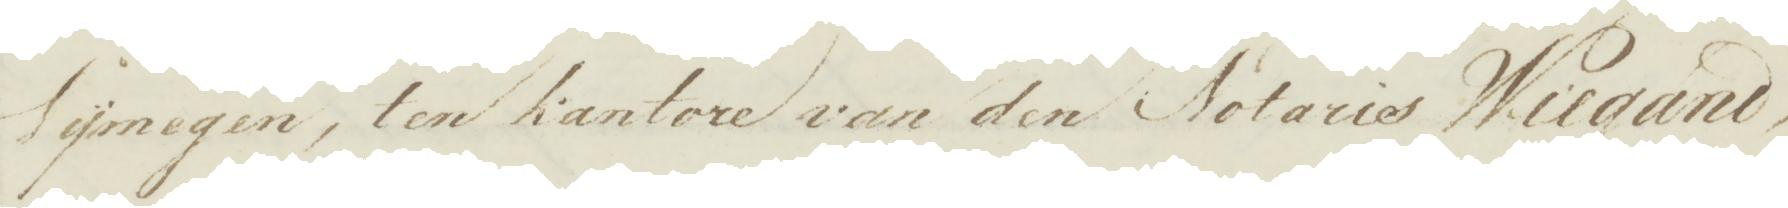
Nijmegen, ten kantore van den Notaris Wiegand,
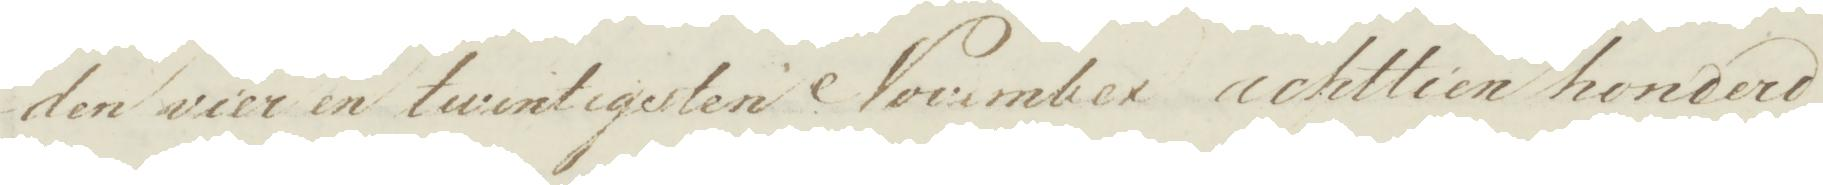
den vier en twintigsten November achttien honderd
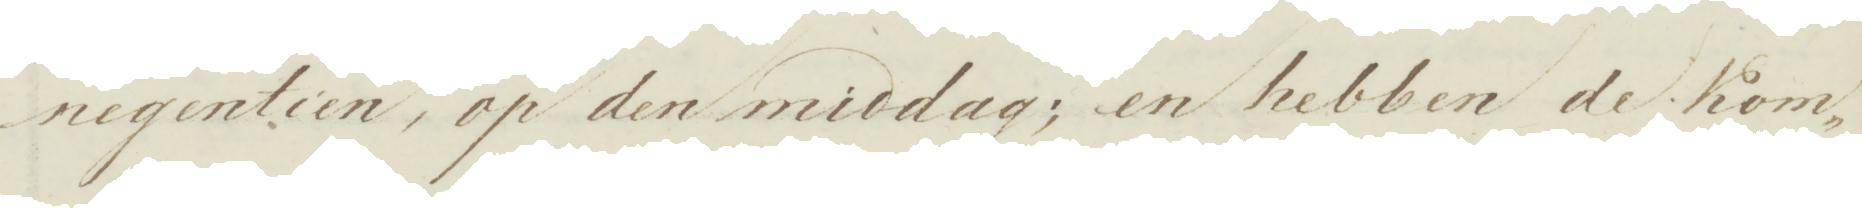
negentien, op den middag; en hebben de Kom„
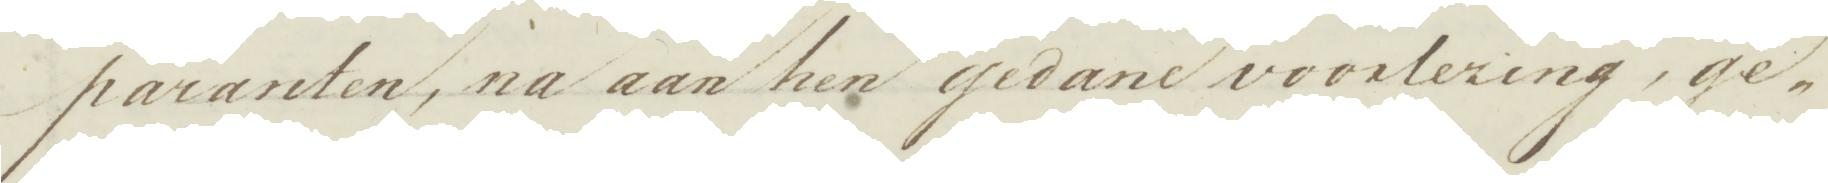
paranten, na aan hen gedane voortering, ge„
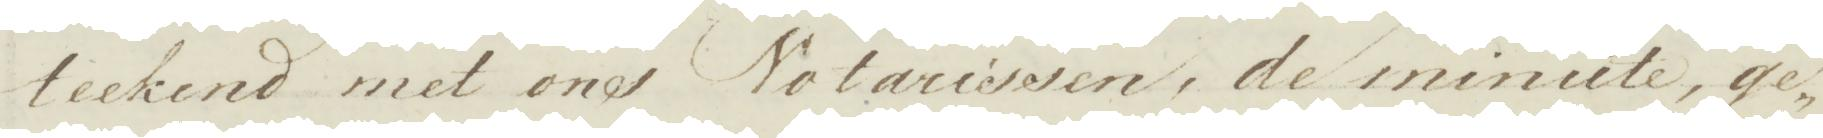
teekend met ons Notarissen, de minute, ge„
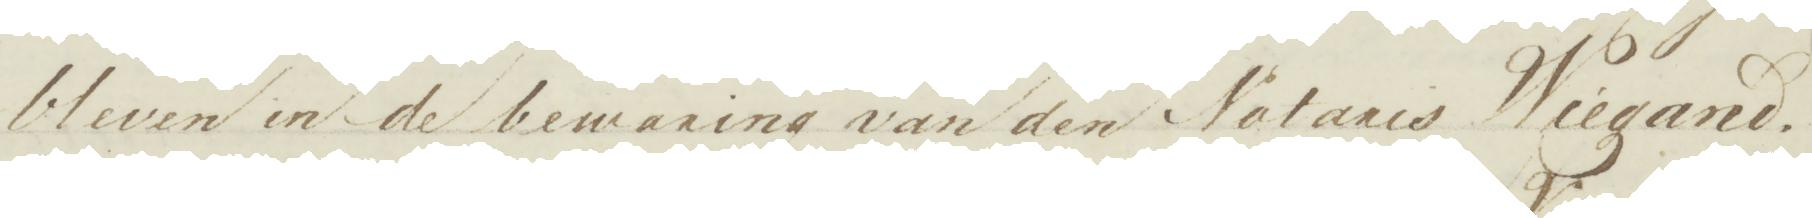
bleven in de bewaring van den Notaris Wiegand.
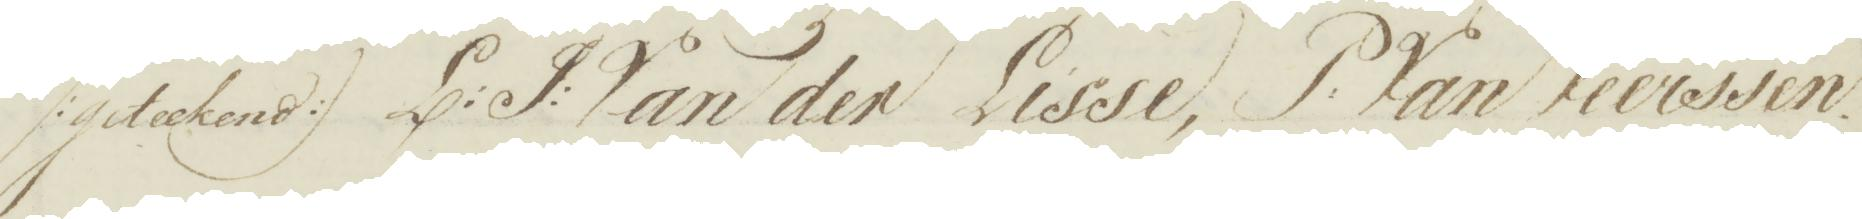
/: geteekend:/ L: I: Van der Lisse, P: Van Veerssen.
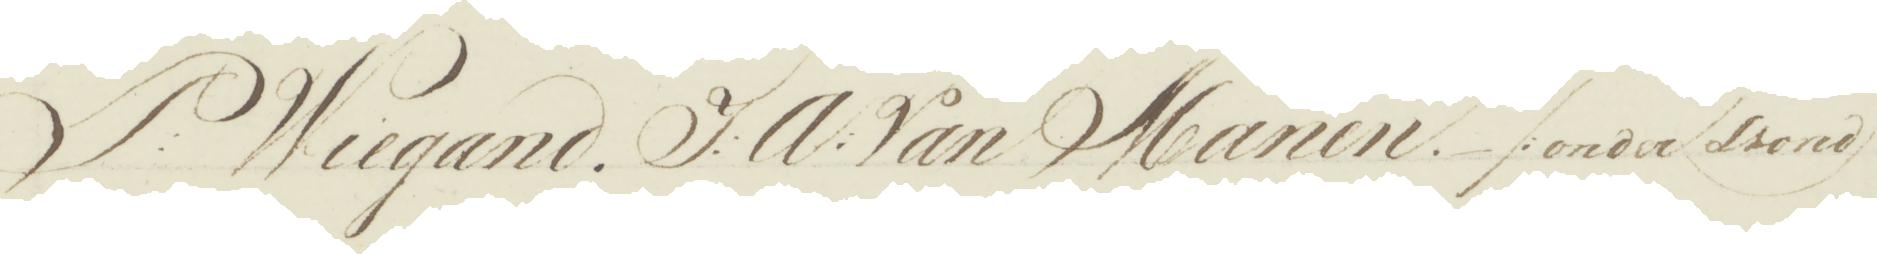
P: Wiegand. I: A: Van Manen. /: onder stond)
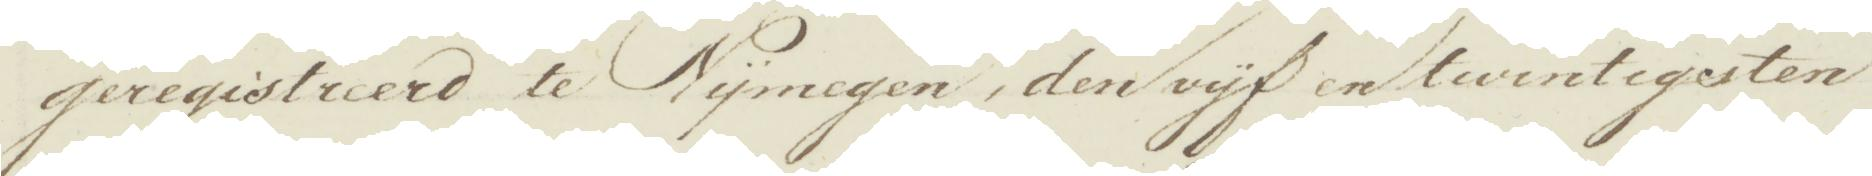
geregistreerd te Nijmegen, den vijf en twintigsten
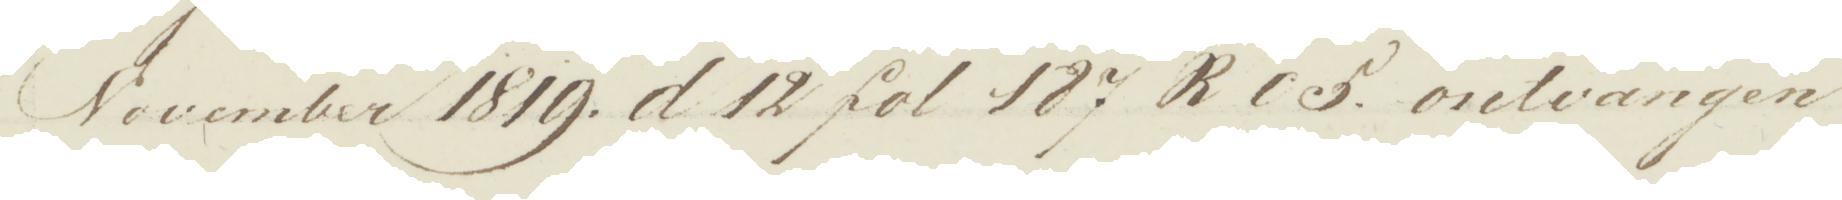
November 1819. d 12 fol 187 R c5. ontvangen
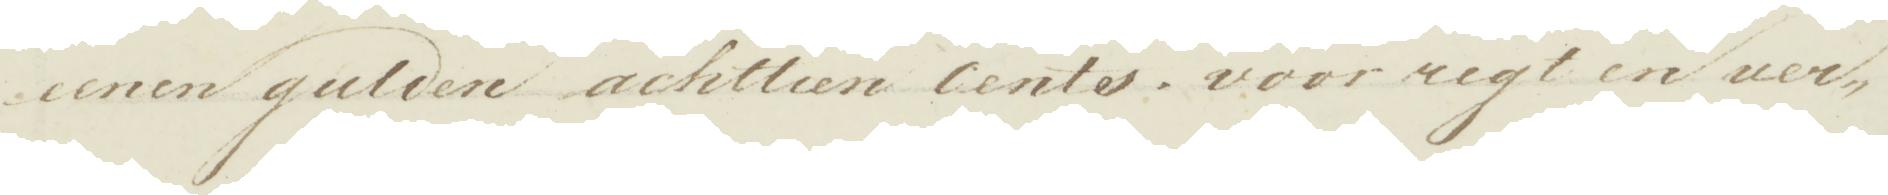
eenen gulden achttien cents. voor regt en ver„
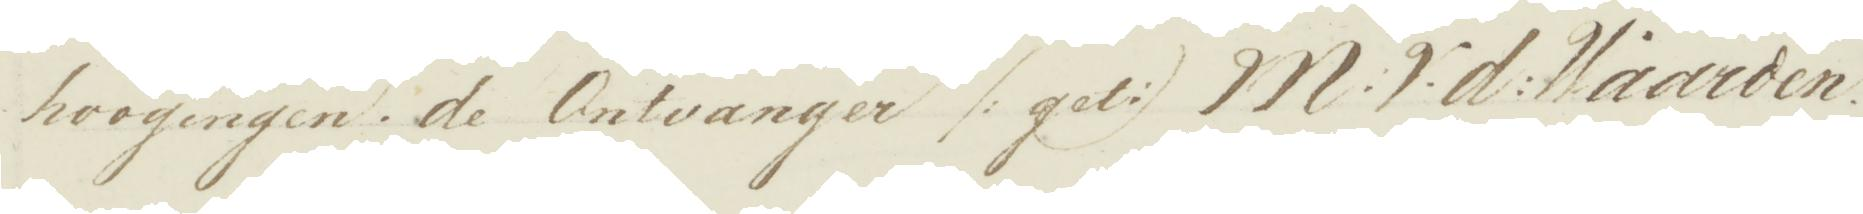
hoogingen. de Ontvanger /:get:) M: V: d: Waarden.
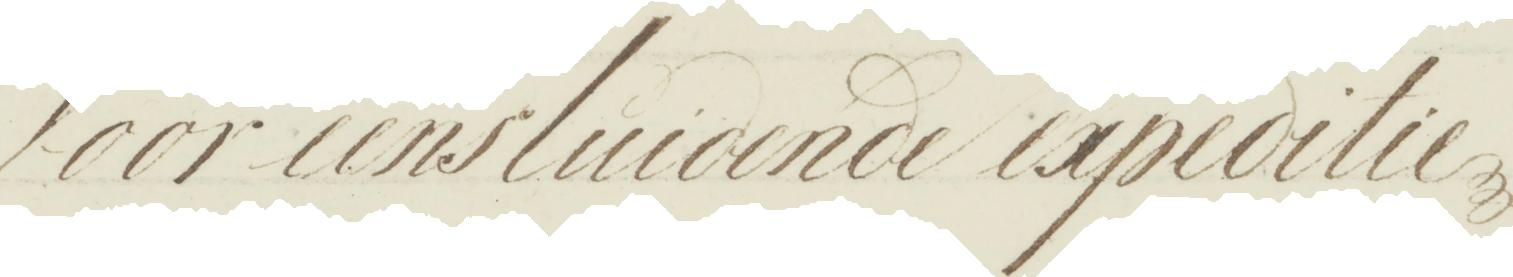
Voor eensluidende expeditie
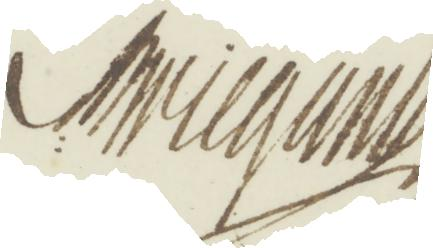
PWiegand
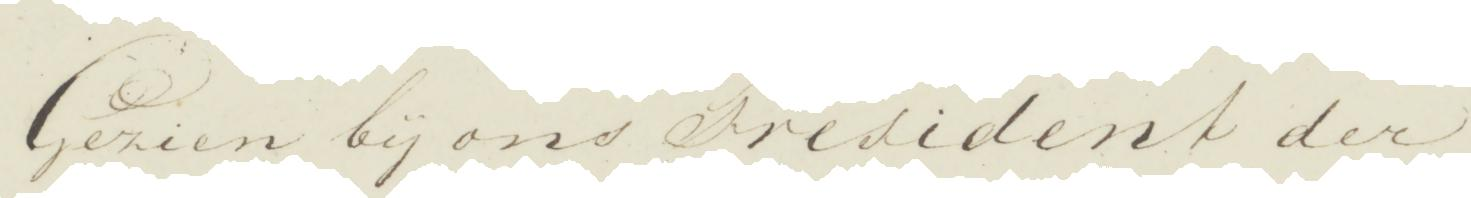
Gezien bij ons President der
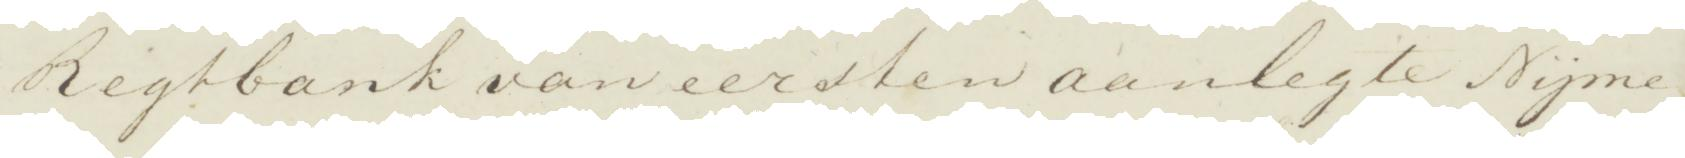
Regtbank van eersten aanleg te Nijme„
